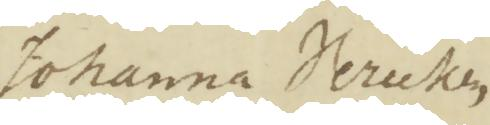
Johanna Vereeken
